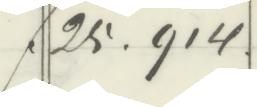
ƒ 25. 914
